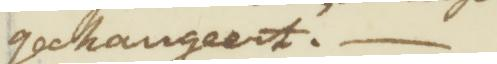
gechangeert.
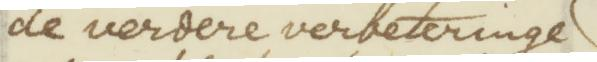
de verdere verbeteringe
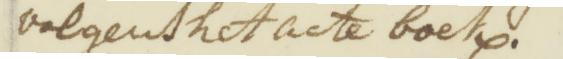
volgens het acte boek
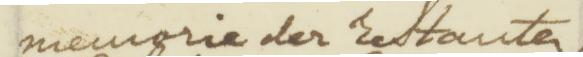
memorie der restanten
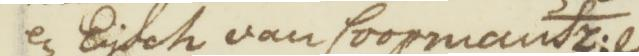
en Eijsch van Coopmansz:
